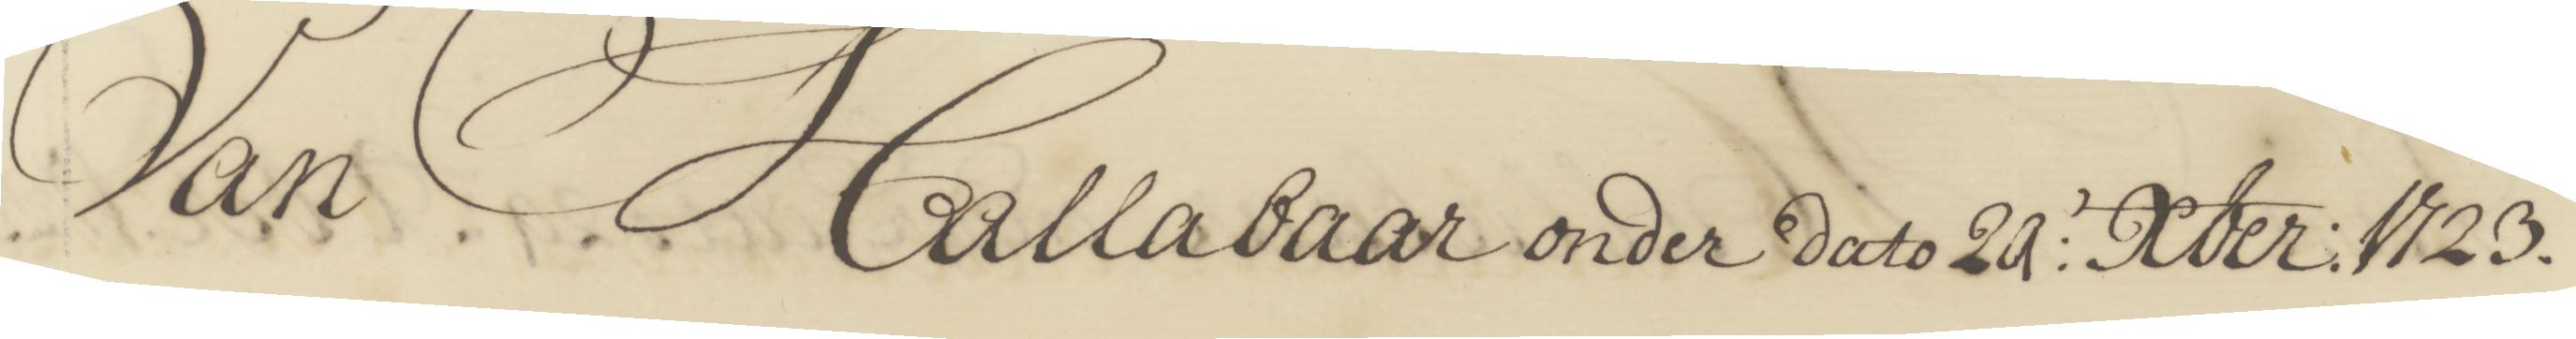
Van Mallabaar onder dato 24:' Xber: 1723.
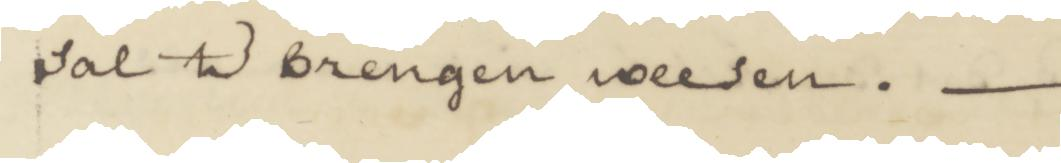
sal te brengen weesen. —
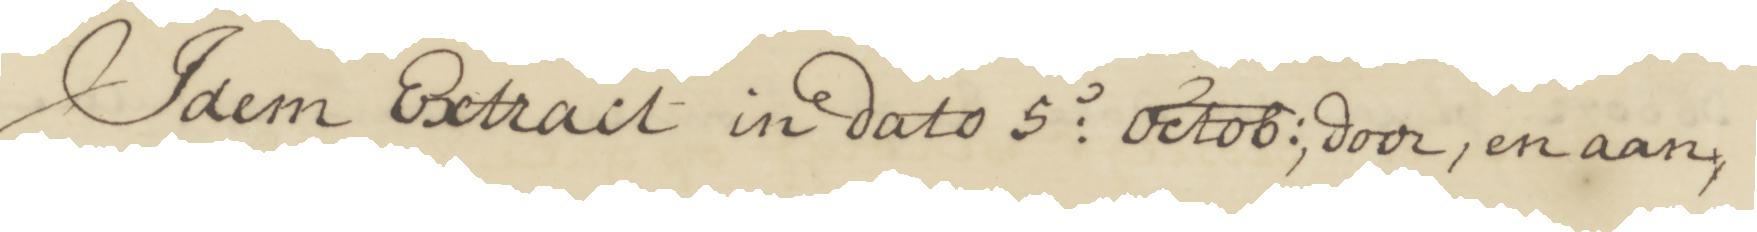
Idem Extract in dato 5:' Octob:, door, en aan,
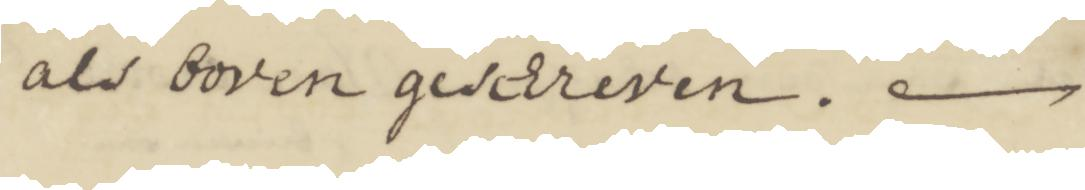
als boven geschreven. —
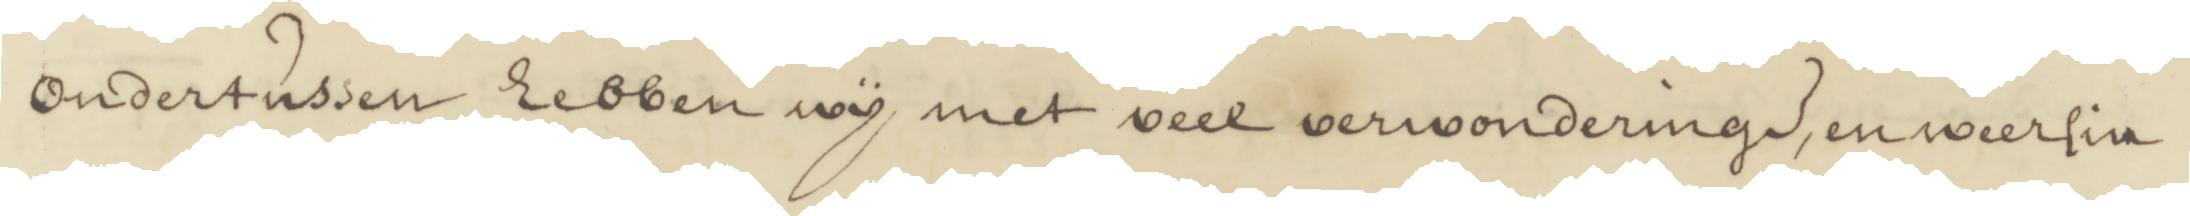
ondertussen hebben wij met veel verwonderinge, en weersin
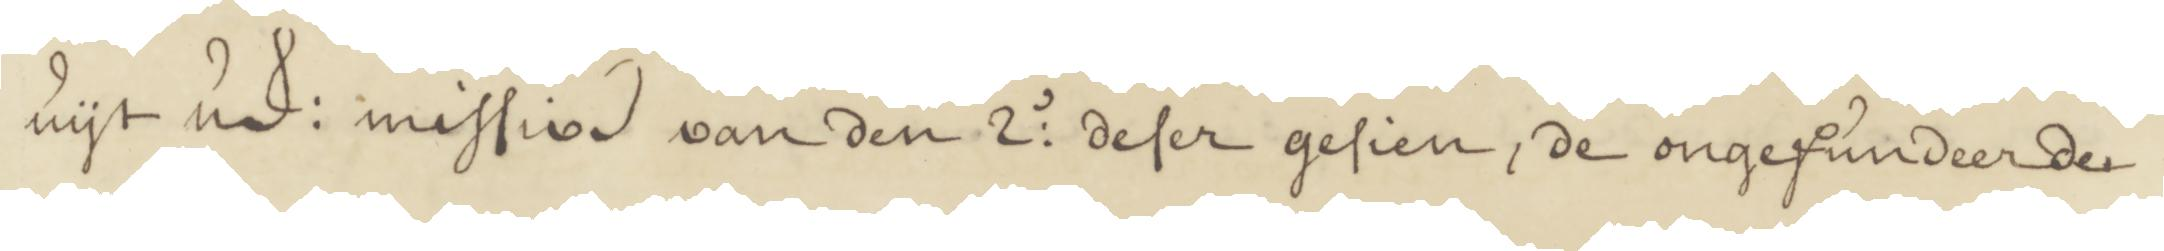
uijt uE: missive van den 2:' deser gesien, de ongefundeerde
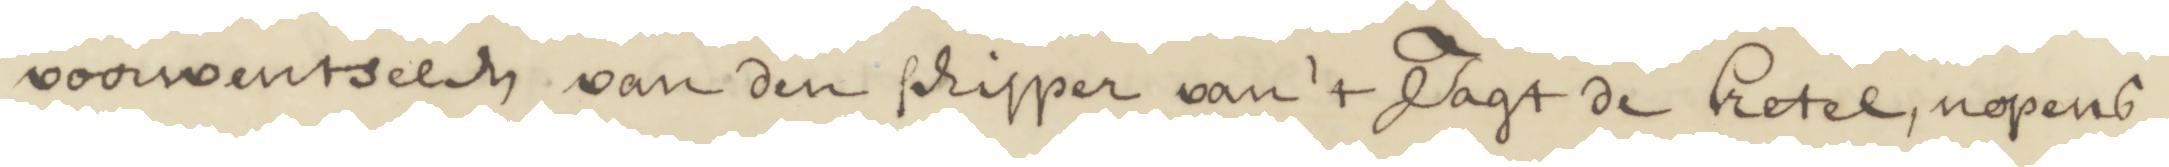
voorwentselen van den schipper van ’t Iagt de ketel, nopens
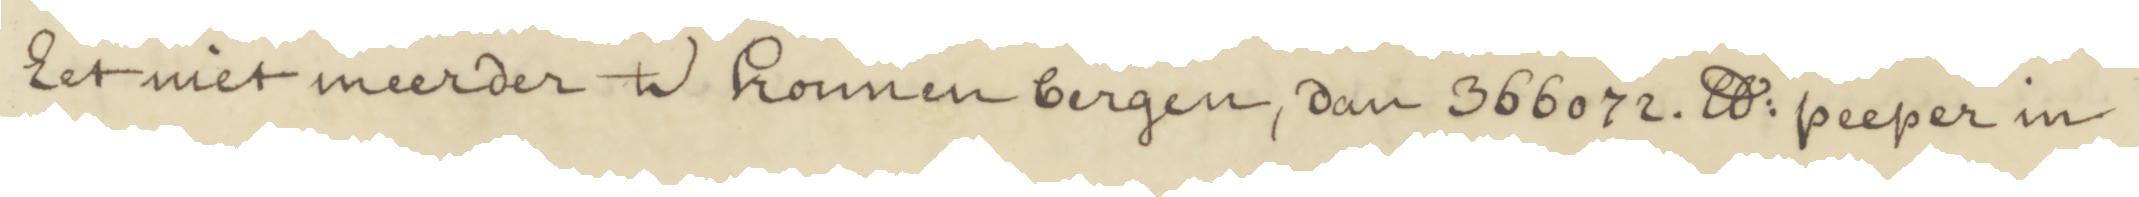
het niet meerder te konnen bergen, dan 366072. lb: peeper in
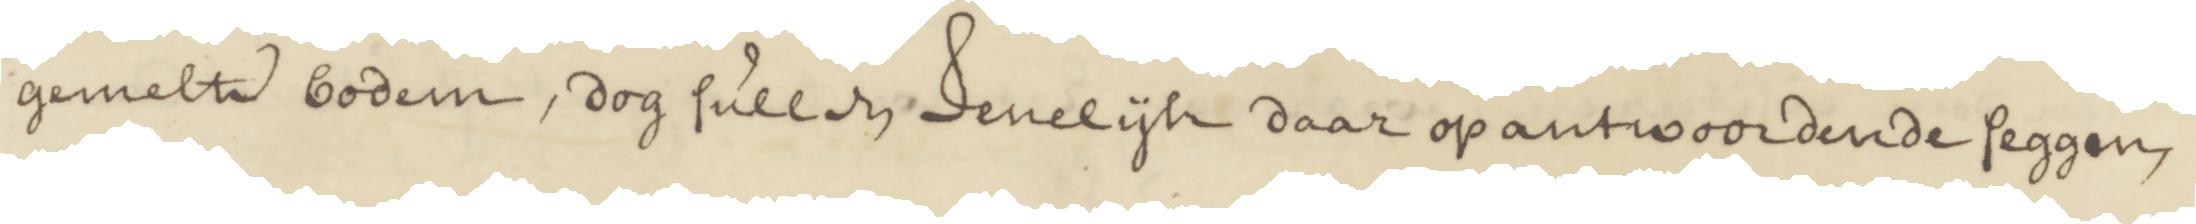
gemelte bodem, dog sullen Eenelijk daar op antwoordende seggen,
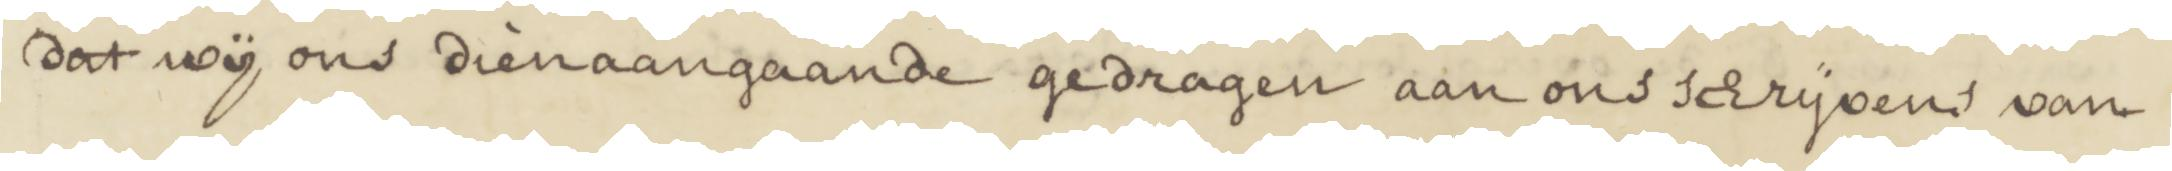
dat wij ons dien aangaande gedragen aan ons schrijvens van
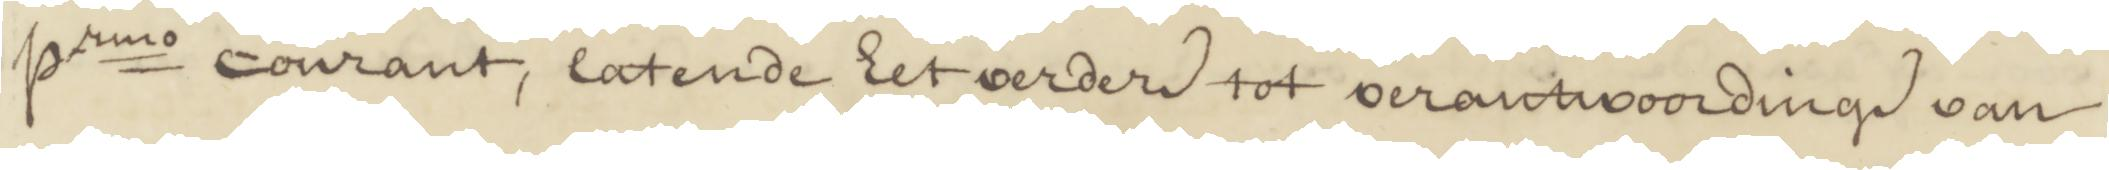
p=rmo courant, latende het verdere tot verantwoordinge van
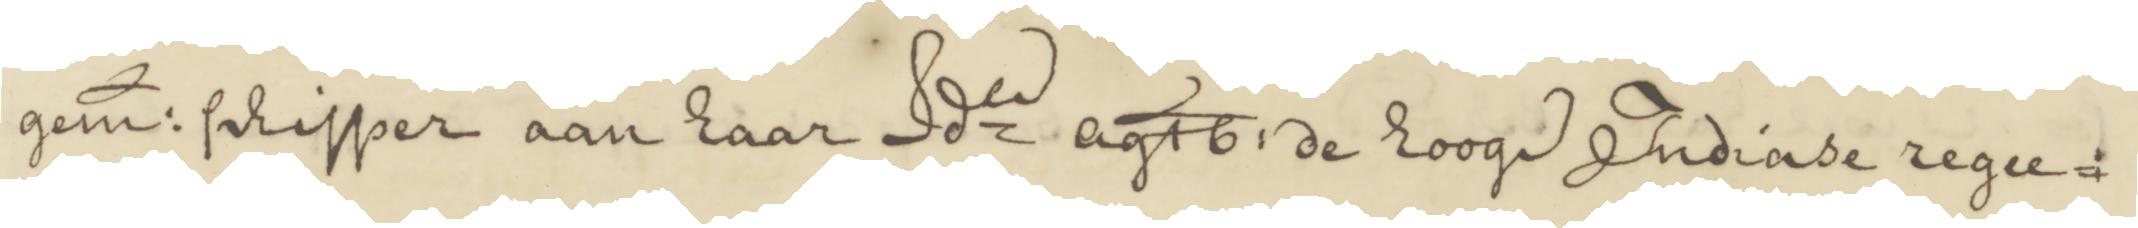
gem:s schipper aan haar Ed=le agtb: de hooge Indiase regie=
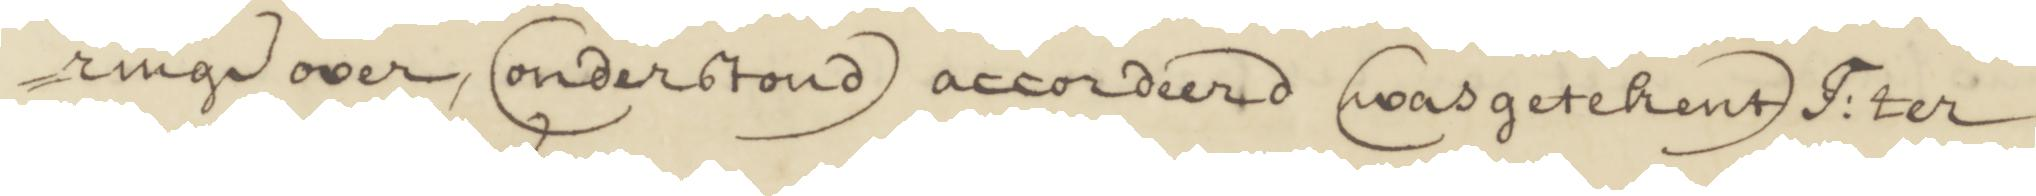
=ringe over, (onderstond) accordeerd (was getekent) T: ter
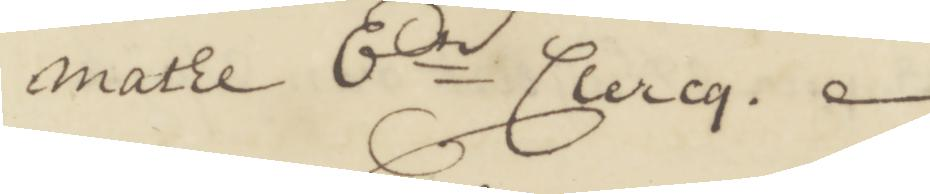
mathe E=te Clercq. —
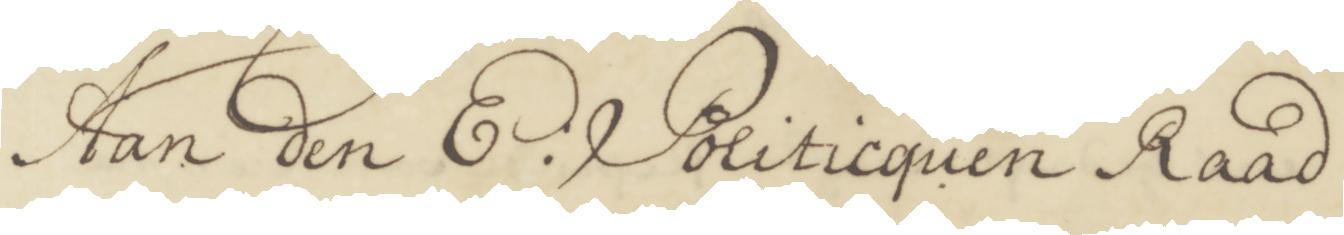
Aan den E: Politicquen Raad
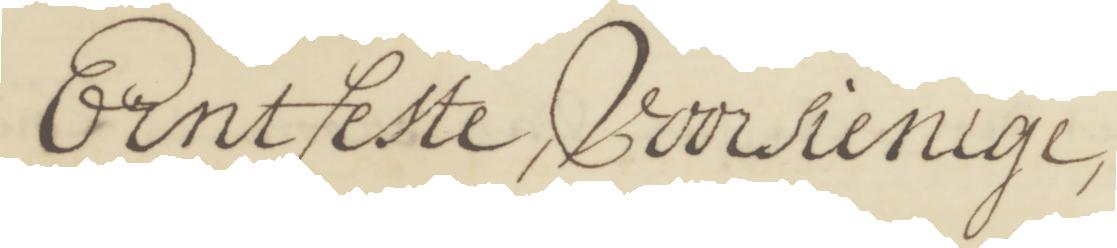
Erntfeste, Voorsienige,
